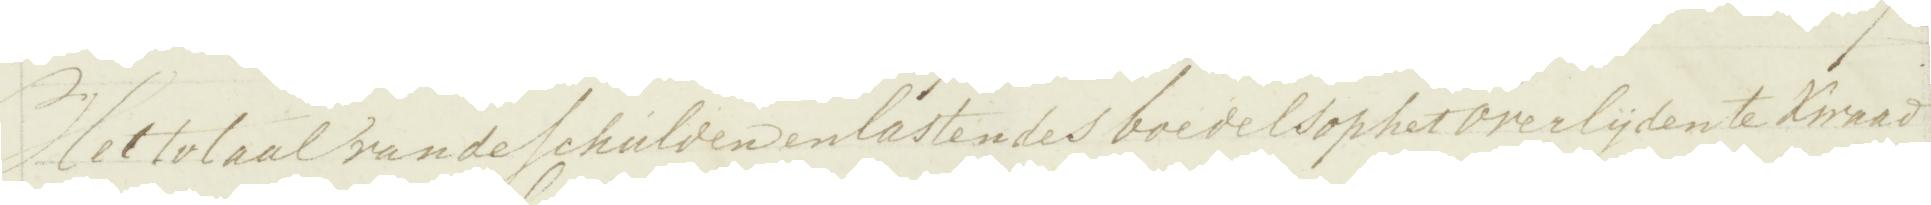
Het totaal van de schulden en lasten des boedels op het overlijden te kwaad
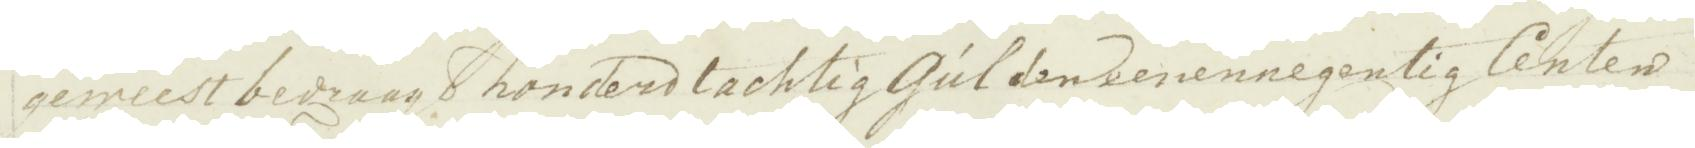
geweest bedraagt honderd tachtig gulden eenennegentig Centen . . . . ƒ 180„91.
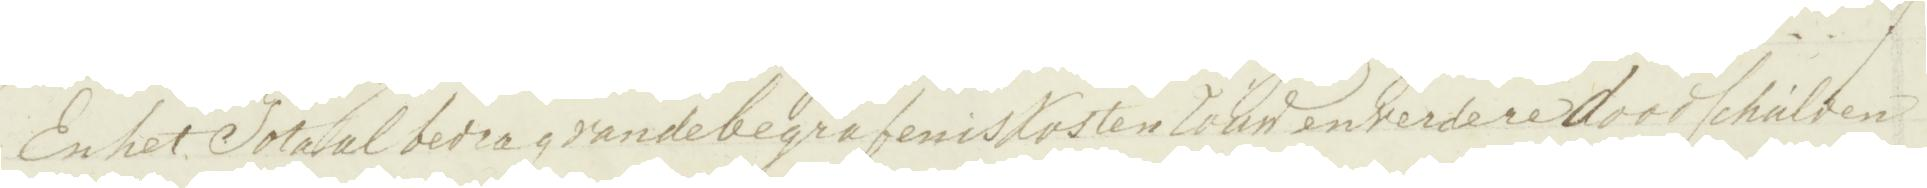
En het Totaal bedrag van de begrafeniskosten rouw en verdere doodschulden
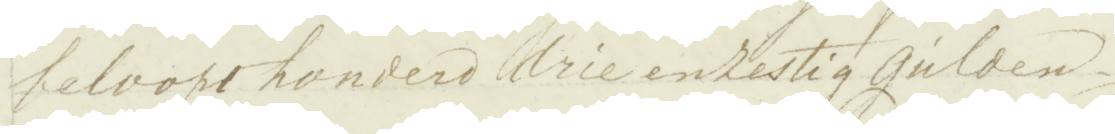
beloopt honderd drie en Zestig gulden . . . . . . . . . . . . . . „ 163. —
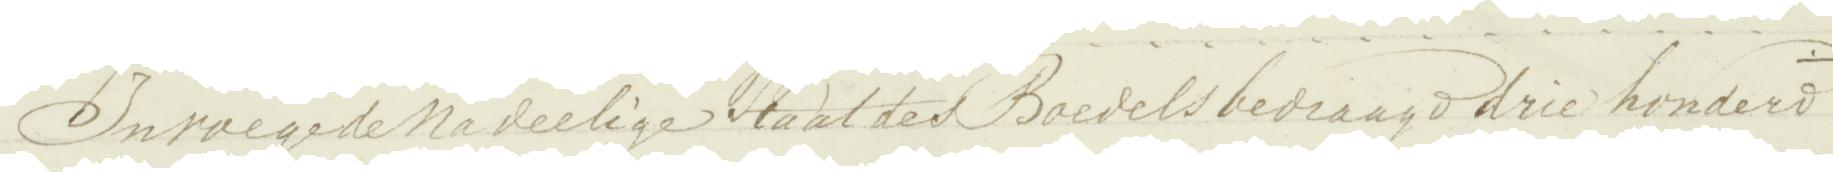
Jnvoege de nadeelige staat des Boedels bedraagd drie honderd
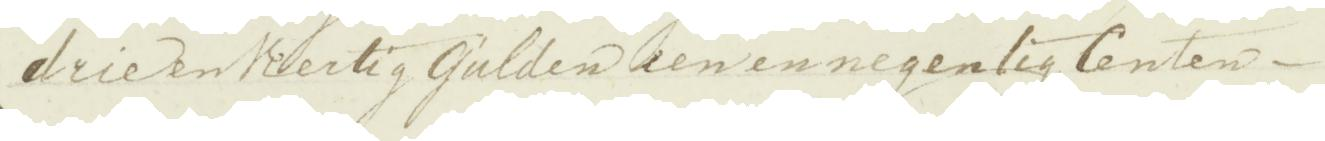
drie en Veertig Gulden een en negentig Centen - - . . . . . . . . . ƒ 343.91.
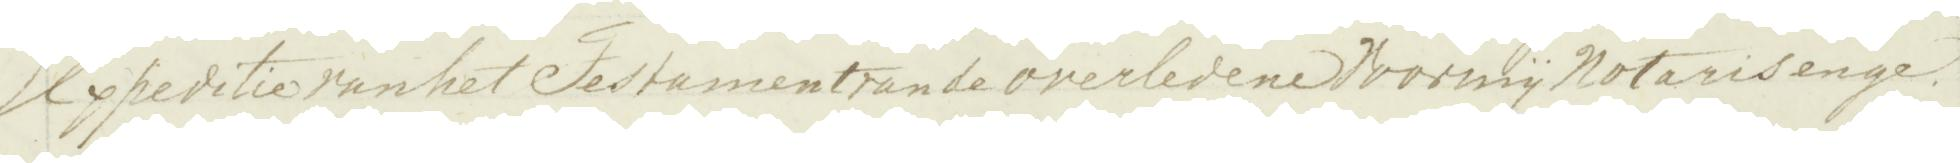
Expeditie van het Testament van de overledene Voor mij Notaris en ge,
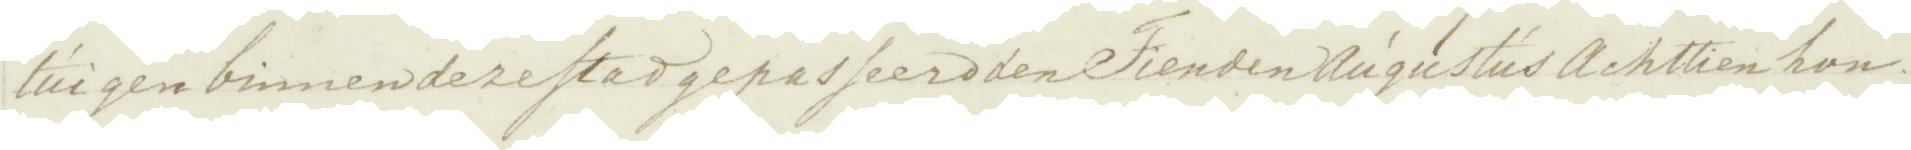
tuigen binnen deze stad gepasseerd den Tienden Augustus Achttien hon.
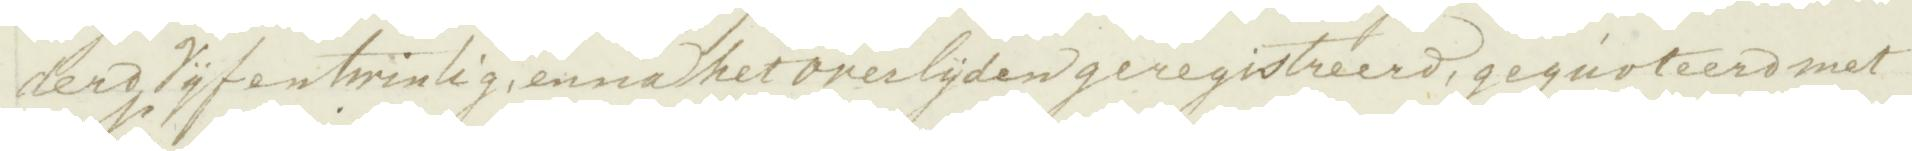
derd, vijf en twintig, en na het overlijden geregistreerd, gequoteerd met N.o 1.
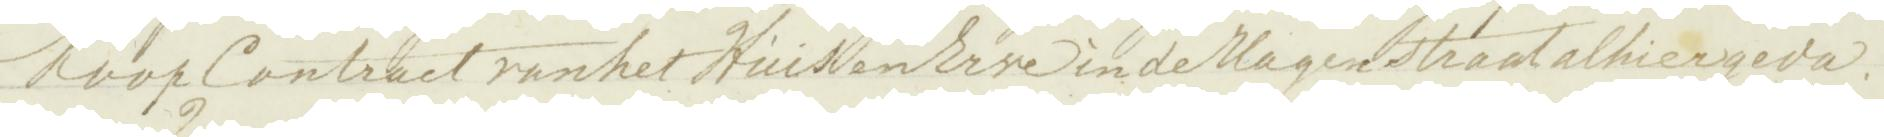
Koop Contract van het Huis en Erve in de Hagenstraat alhier geda.
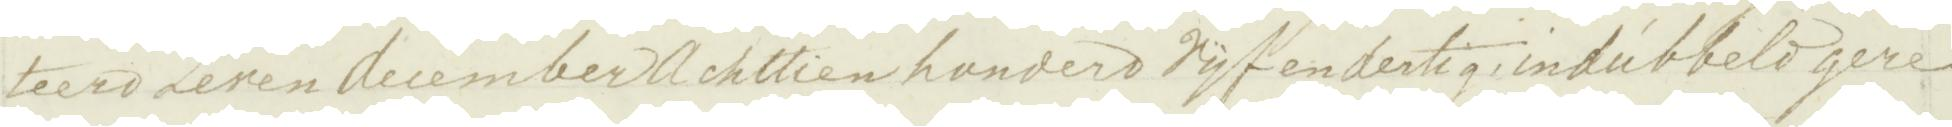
teerd Zeven december Achttien honderd Vijf en dertig, indubbeld gere
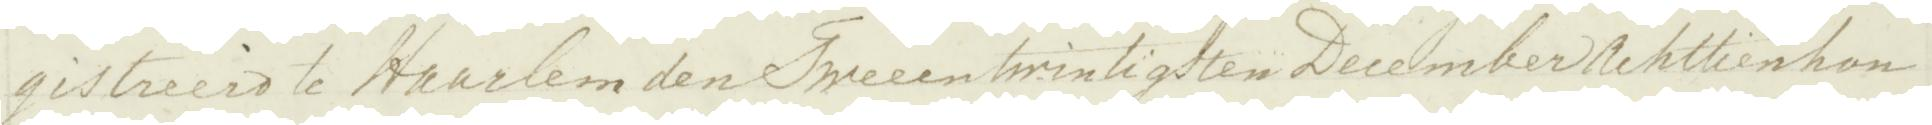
gistreerd te Haarlem den Tweeen twintigsten December Achttienhon
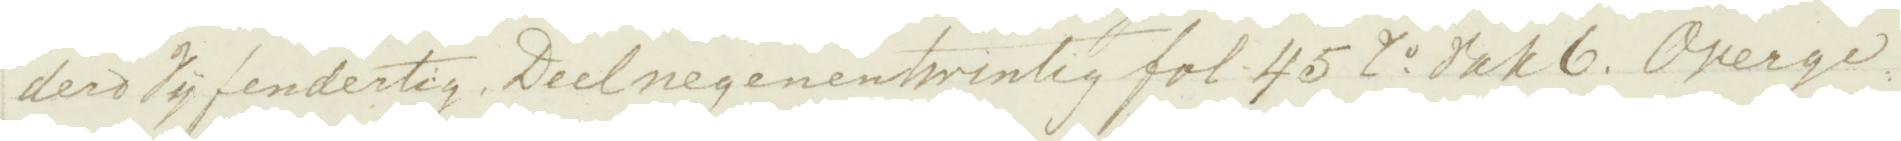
derd Vijfendertig, Deel negenentwintig fol. 45 r.o vak 6. Overge„
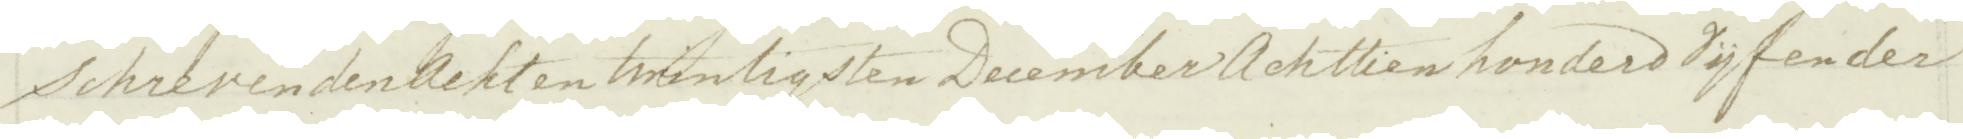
schreven den Acht en twintigsten December Achttien honderd Vijf en der
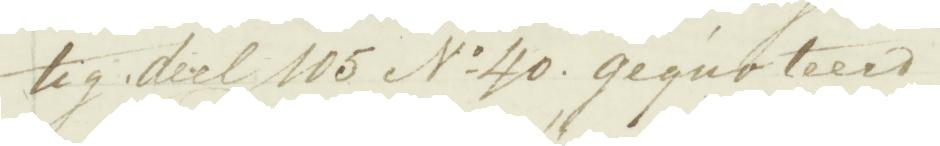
tig deel 105 N-o 40. gequoteerd . . . . . . . . . . . . . . .
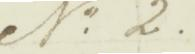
N.o 2.
